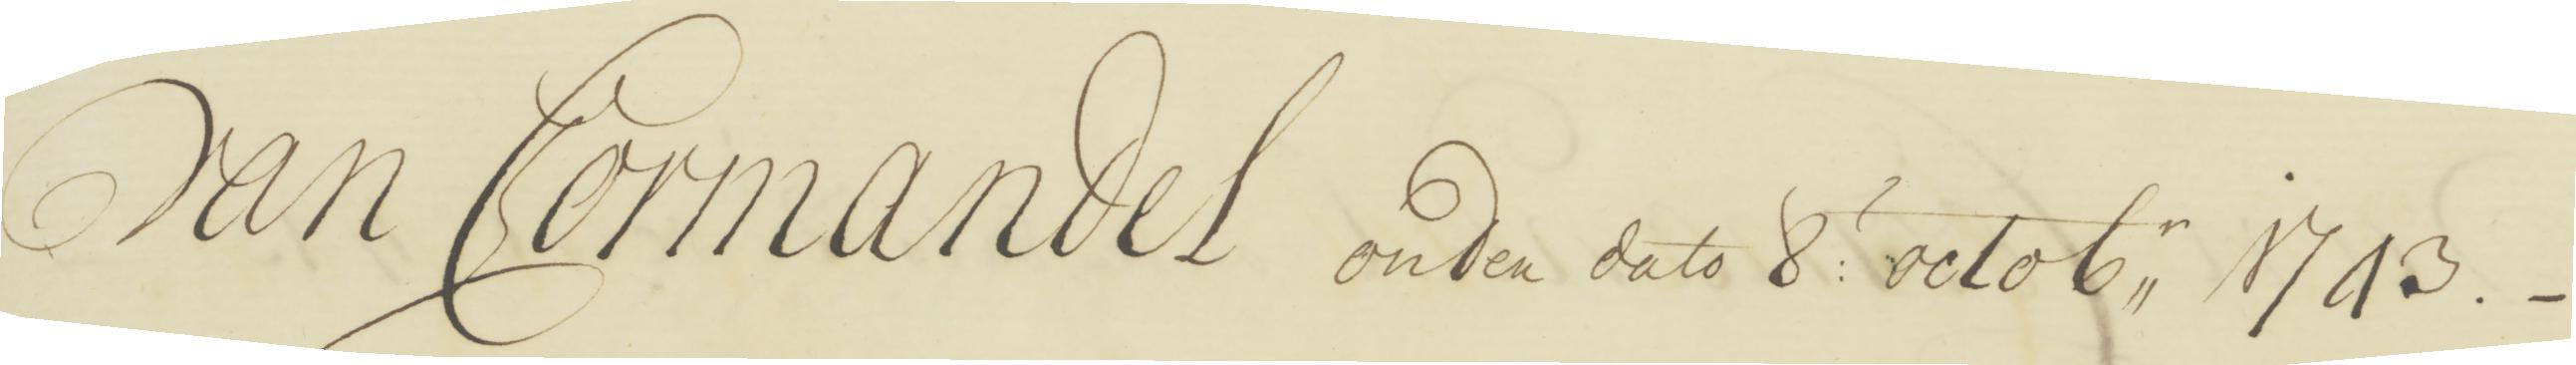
Van Cormandel onder dato 8:' octob„r 1743. —
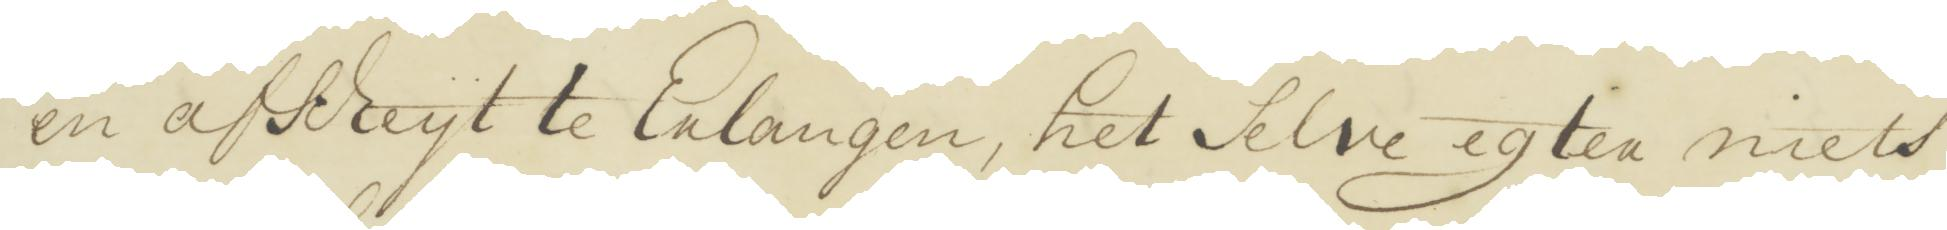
en afscheijt te Erlangen, het selve egter niets
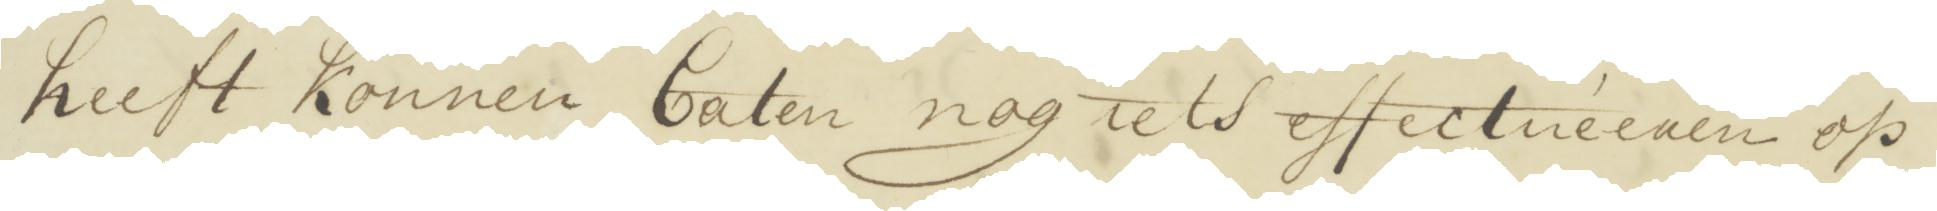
heeft konnen baten nog iets effectueeren op
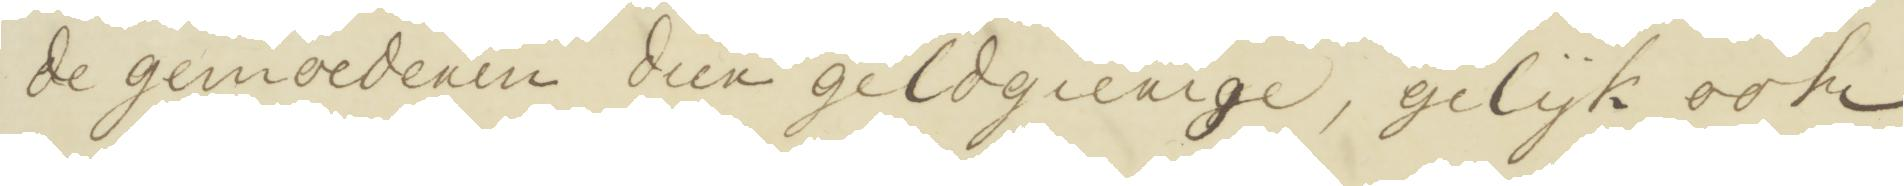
de gemoederen dier geldgierige, gelijk ook
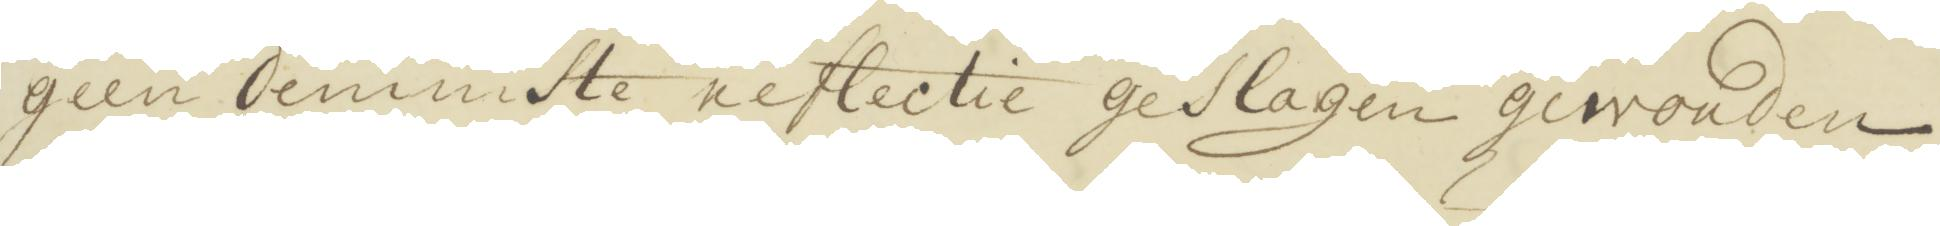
geen deminste reflectie geslagen geworden
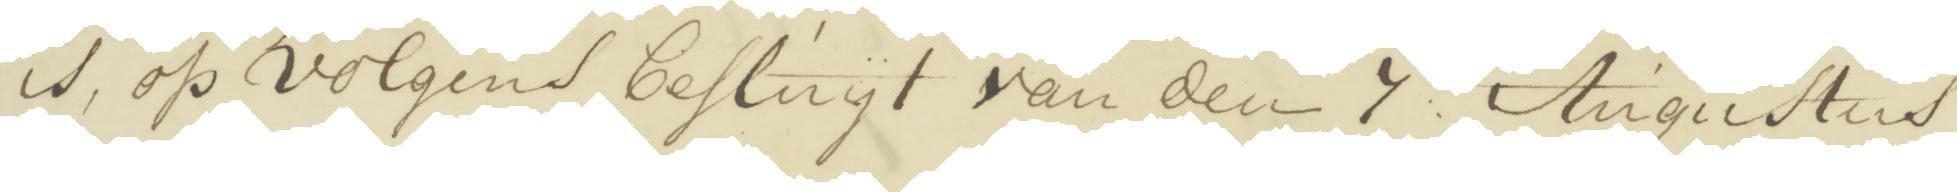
is, op volgens besluijt van den 7:' Augustus
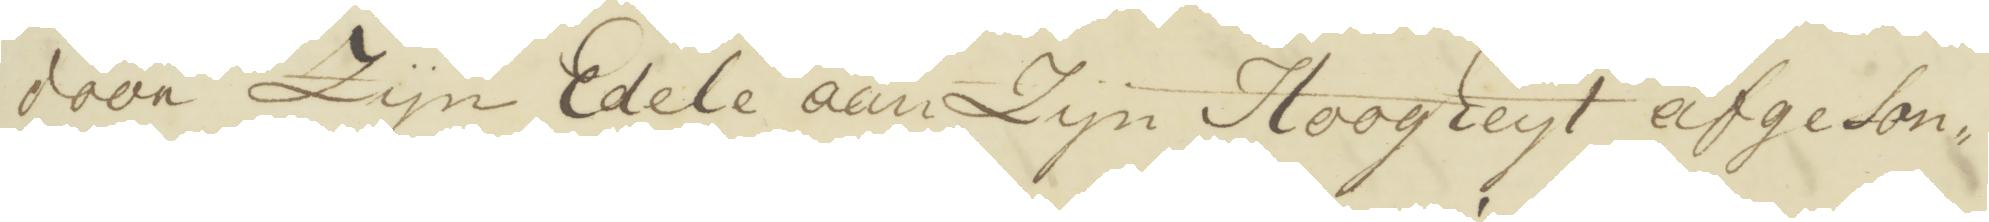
door zijn Edele aan zijn Hoogheijt afgeson„
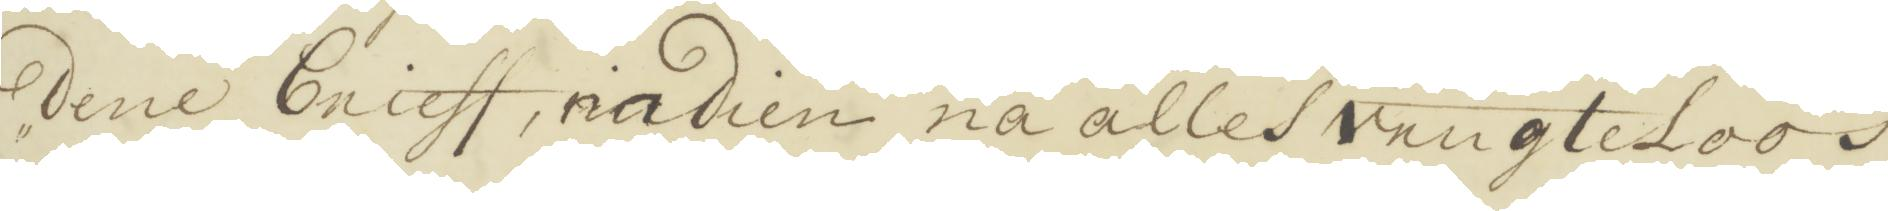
„dene brieff, nadien na alles vrugteloos
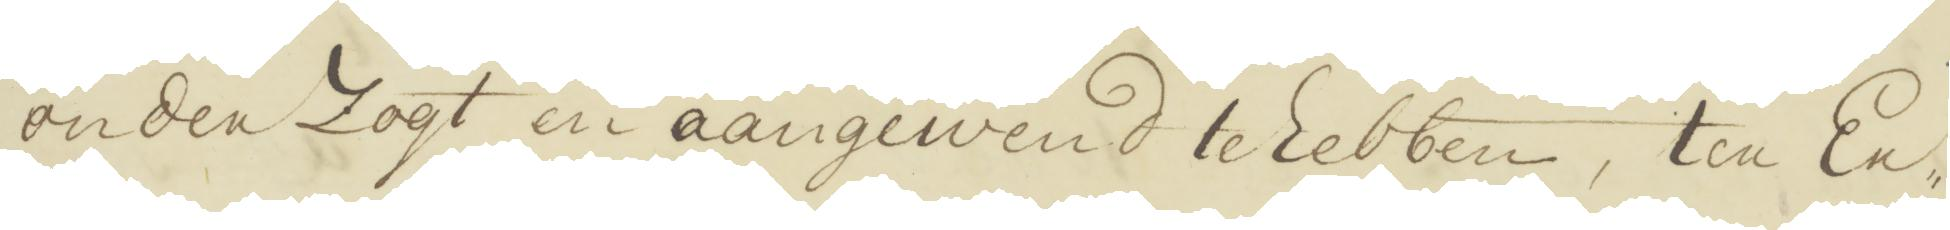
onderzogt en aangewend te hebben, ter Er„
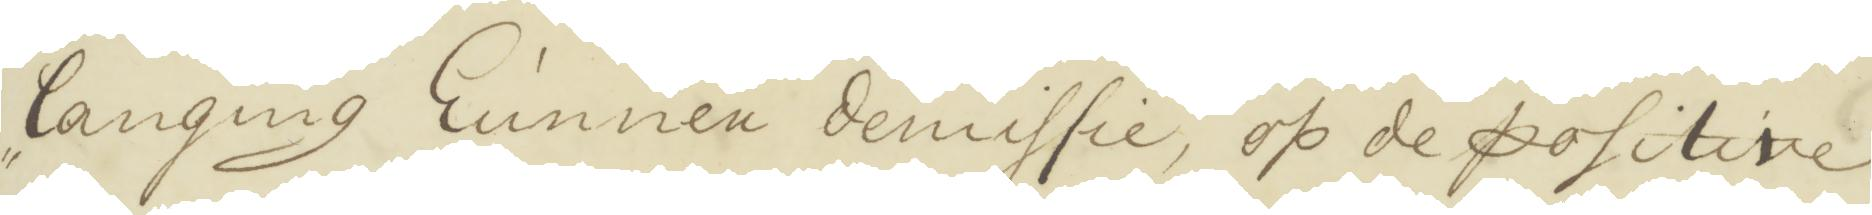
„langing hunner demissie, op de positive
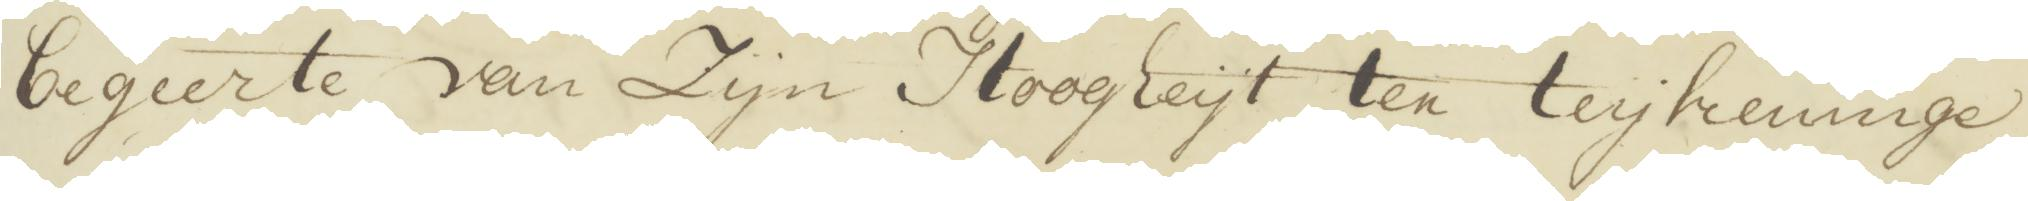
begeerte van zijn Hoogheijt ter teijkeninge
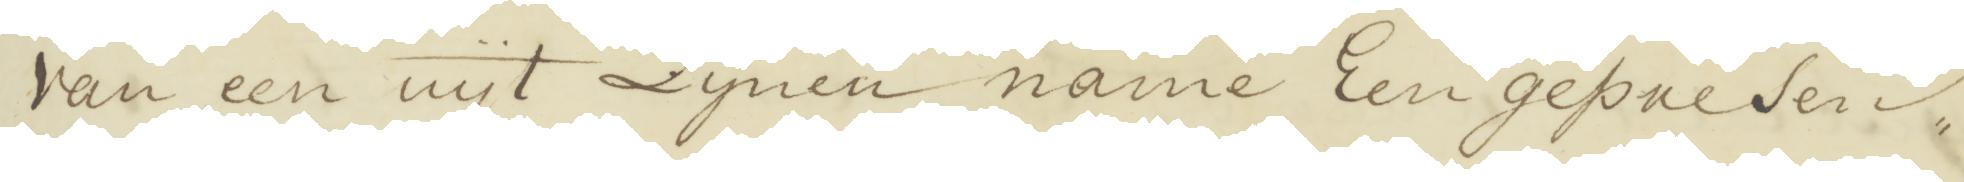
van een uijt zijnen name Een gepresen„
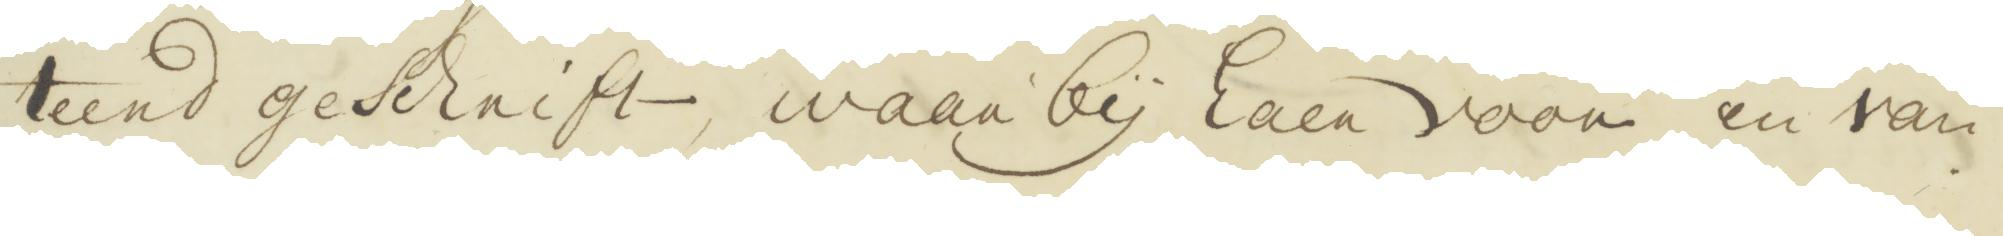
teerd geschrift, waar bij haer voor en van
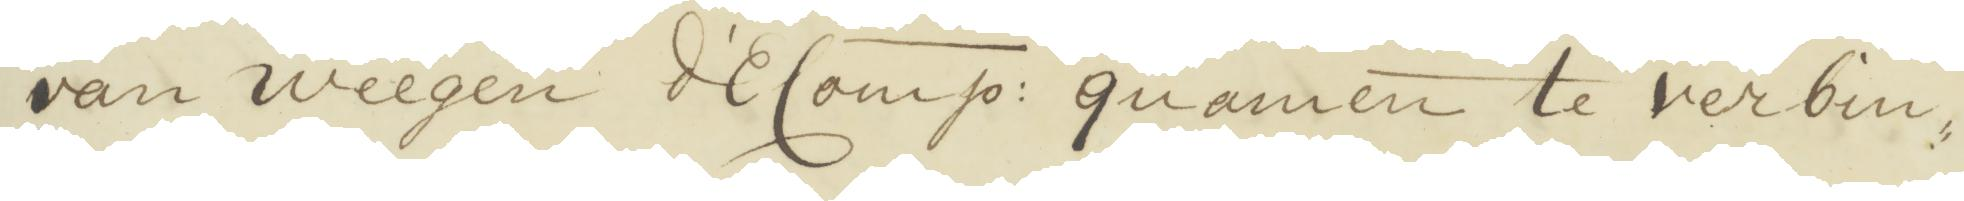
van weegen d'E Comp: quamen te verbin„
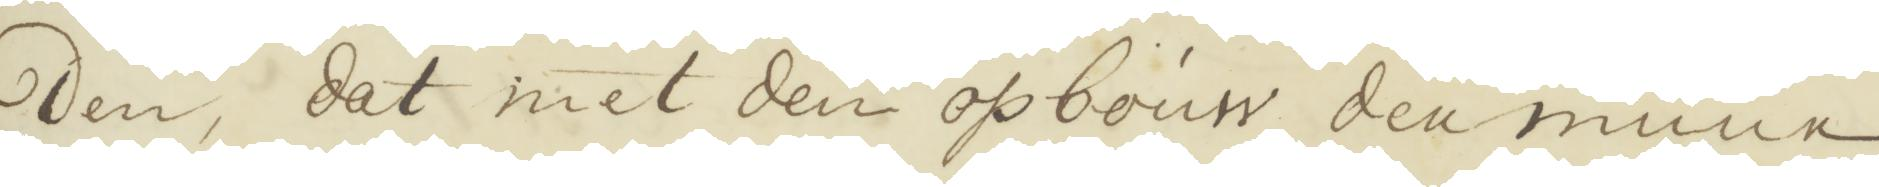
den, dat met den opbouw der muur
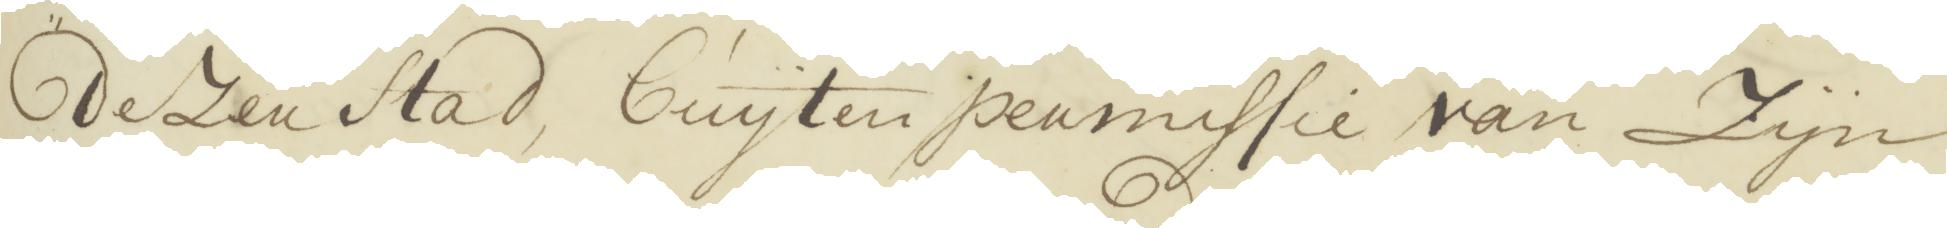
dezer stad, buijten permissie van zijn
